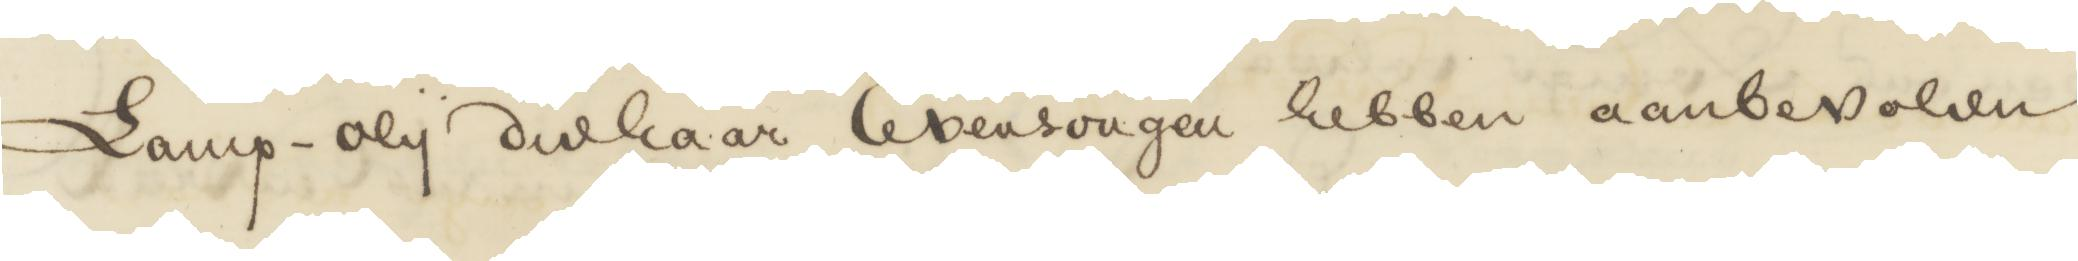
Lamp-olij die haar teversorgen hebben aanbevolen
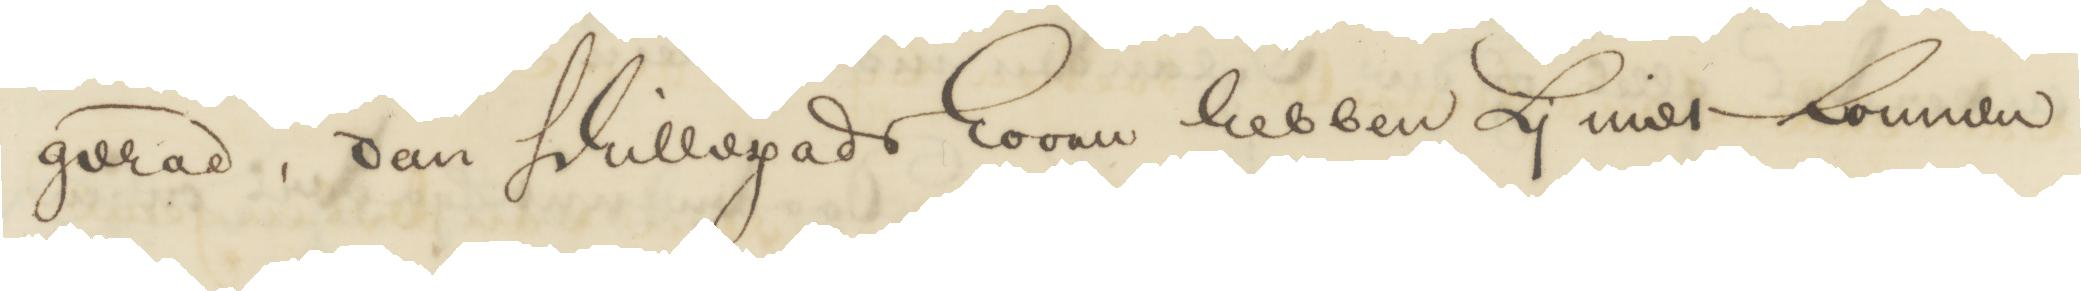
gehad, van schillepads hoorn hebben sij niet konnen
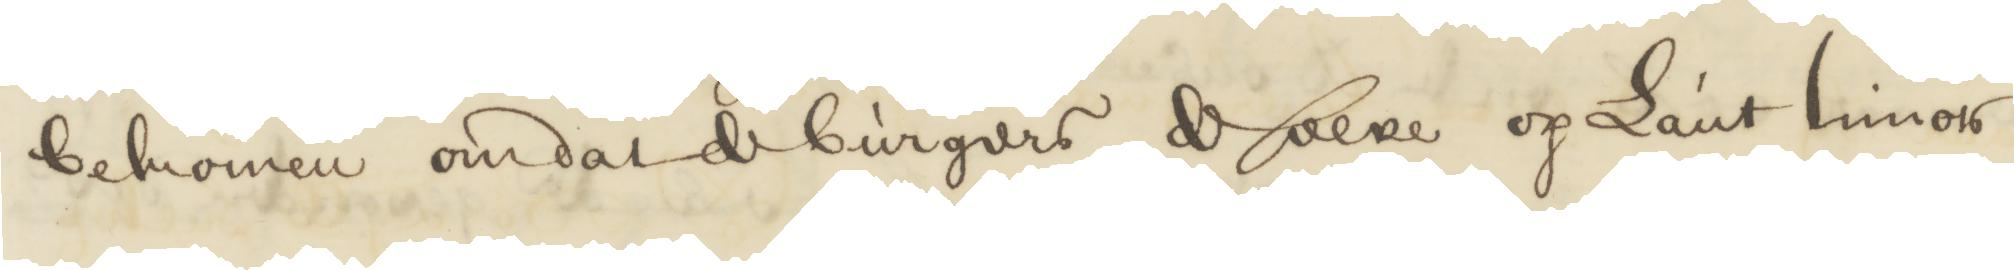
bekomen om dat de burgers deselve op Laut timots
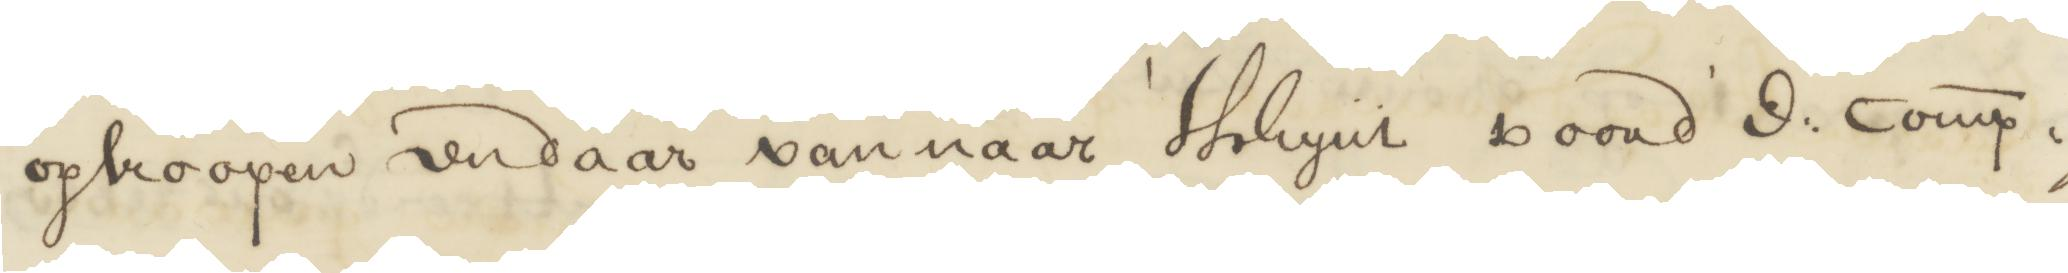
opkoopen en daar van naar 'tschijnt voor d’ E: Comp
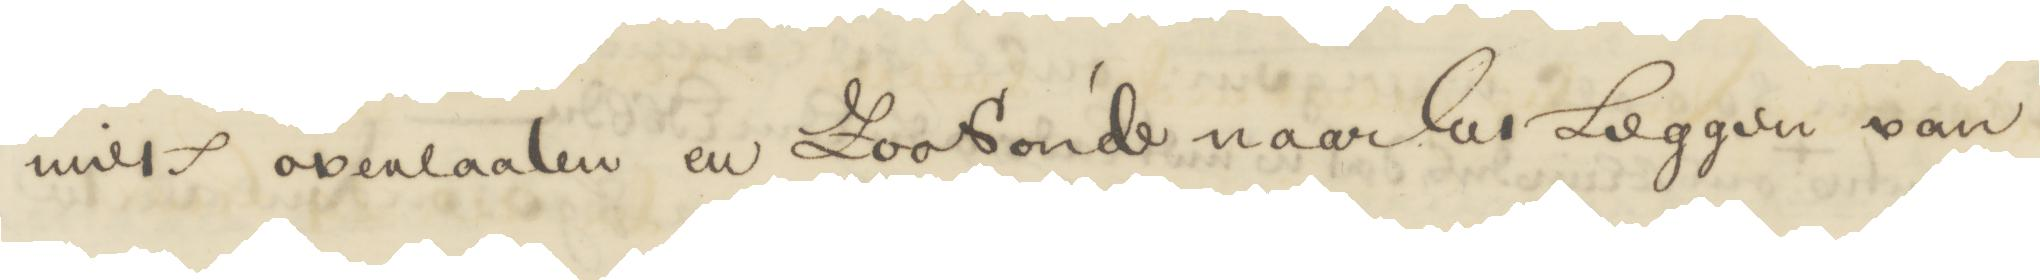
niets overlaaten en zoo soude naar het leggen van
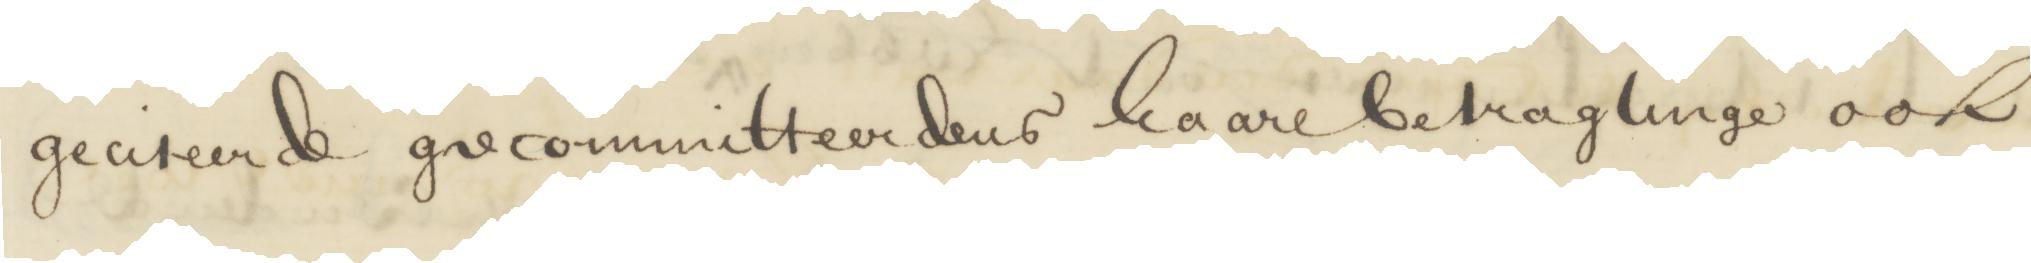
geciteerde gecommitteerdens haare betragtinge ook
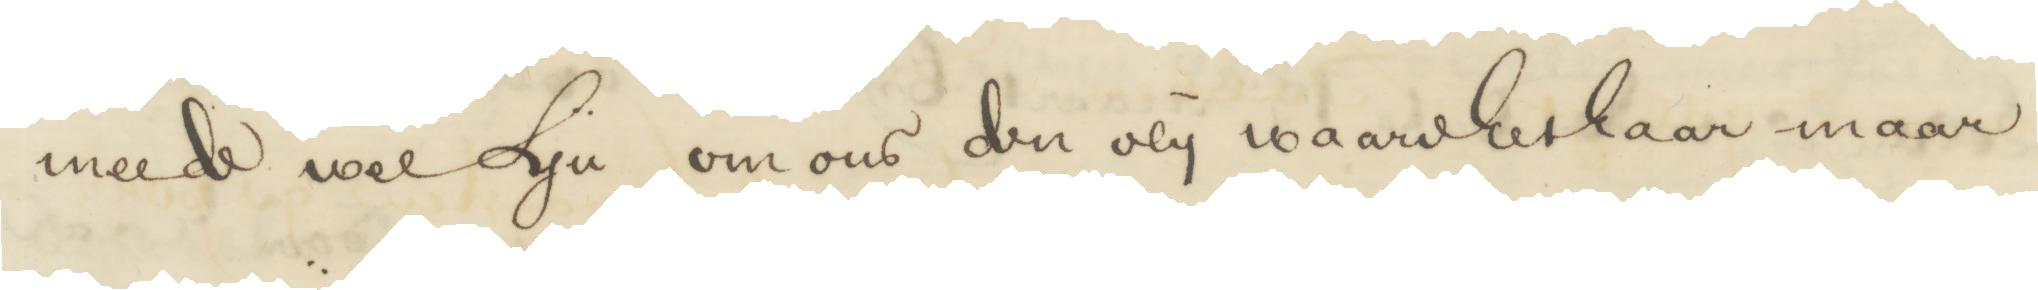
meede wel sijn om ons den olij waare het haar maar
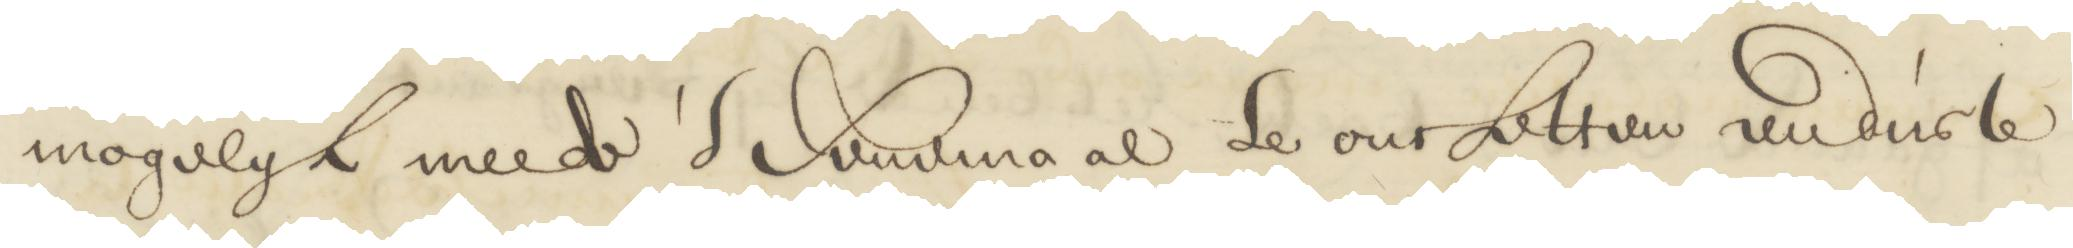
mogelijk meede 't Eenemaal te ontsetten en dus te
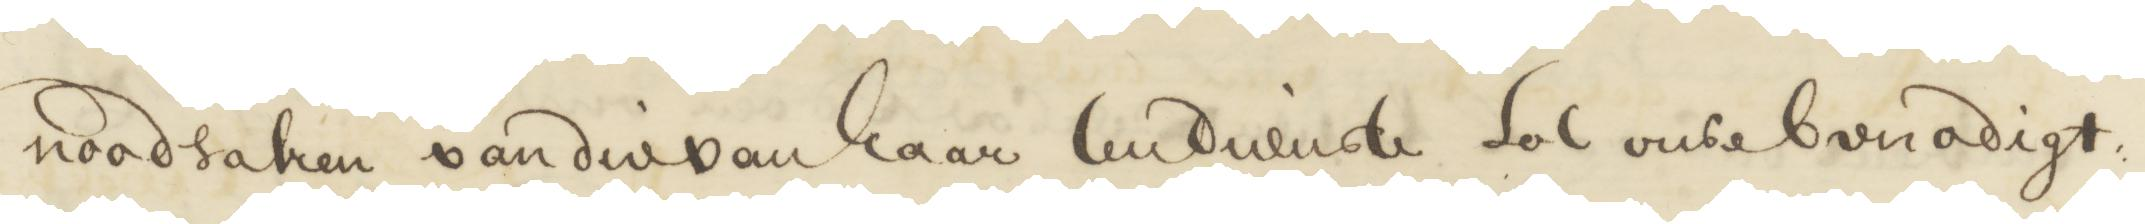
noodsaken van die van haar ten dienste tot onse benodigt„
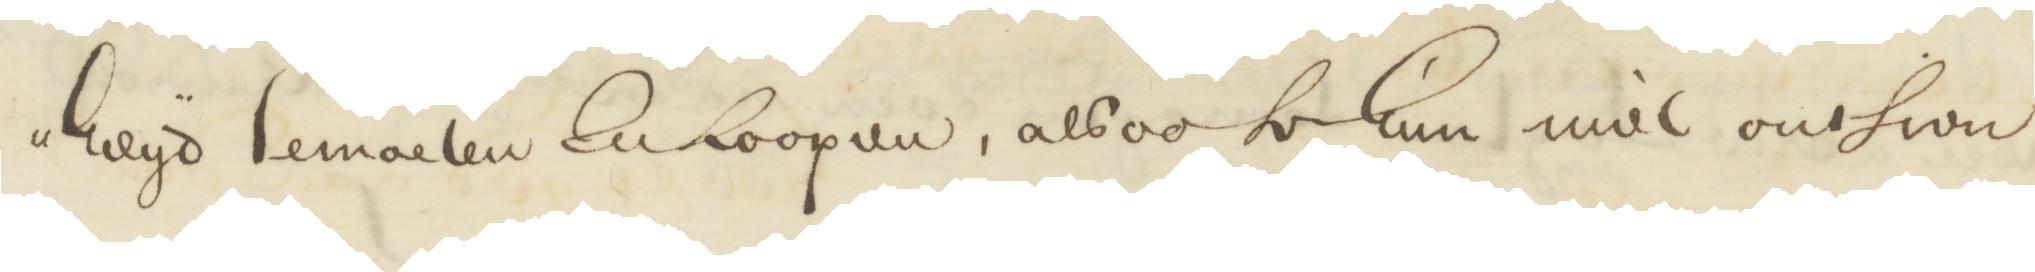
„heijd temoeten Inkoopen, alsook hun niet ontsien
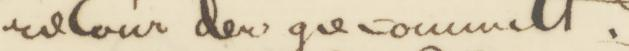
retour der gecommitts.
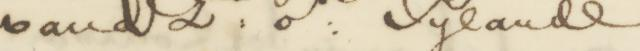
van de z:t o:ter Eylande
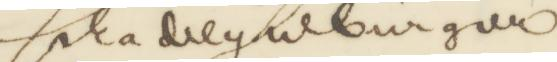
schadelijke burger
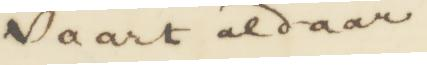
vaart aldaar
